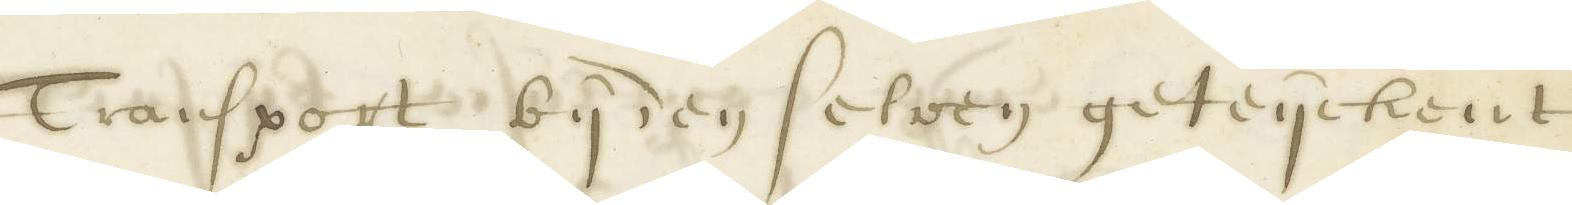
Transport bij den selven geteijckent
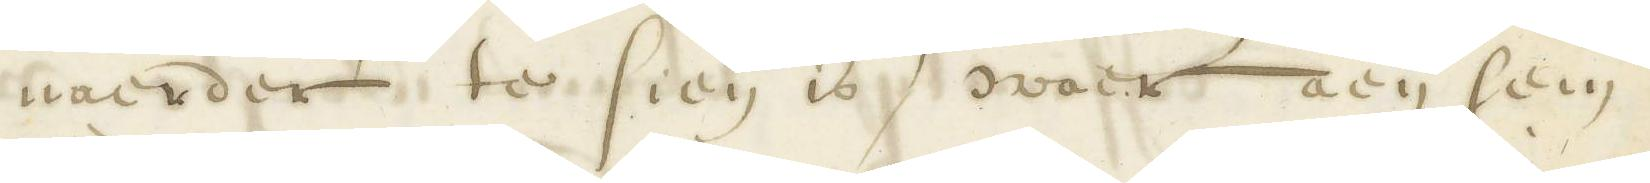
naerder te sien is waer aen hem
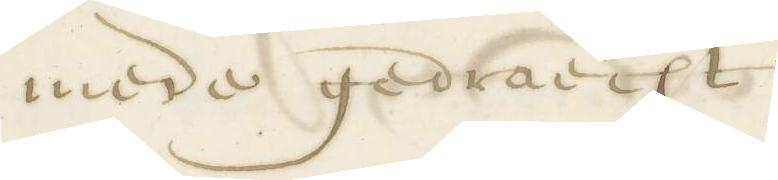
mede gedraecht
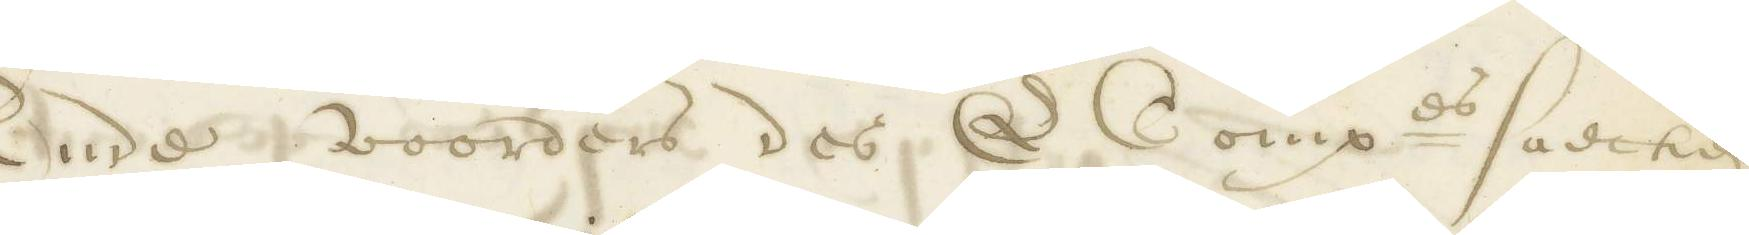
Ende voorders des E Comp=e saecken
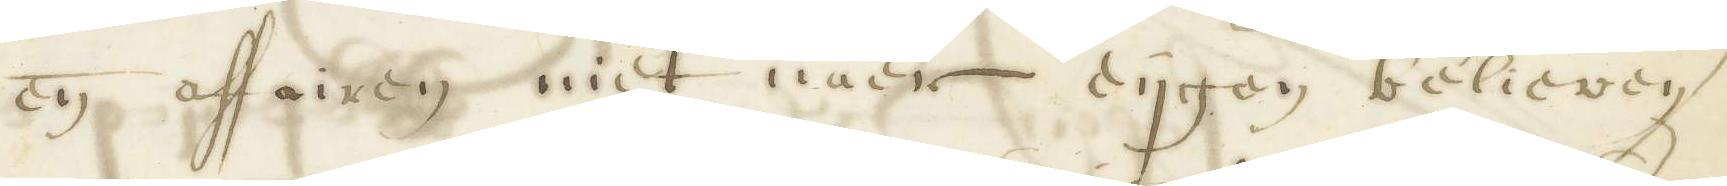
en affairen niet naer eijgen believen
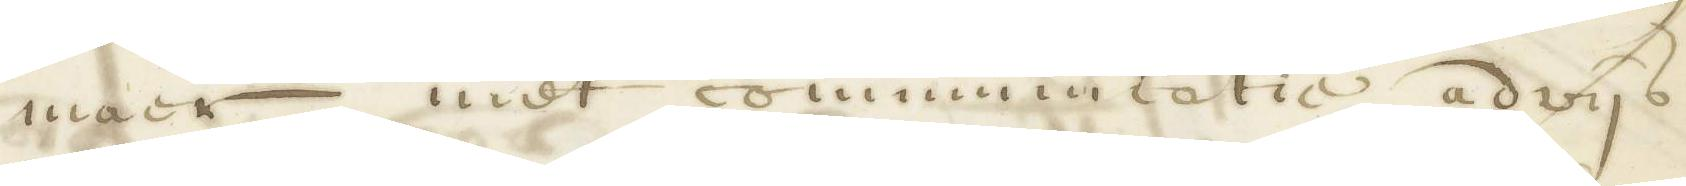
maer met communicatie advijs
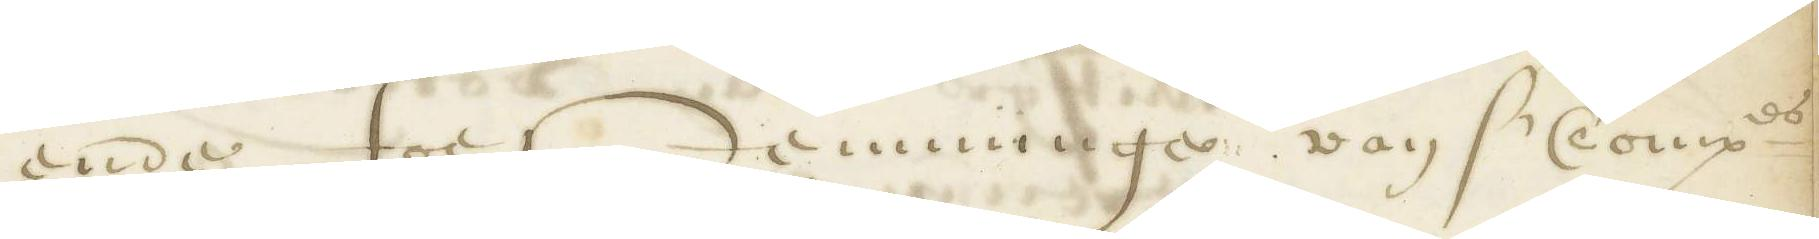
ende toestemminge van s Comp=s
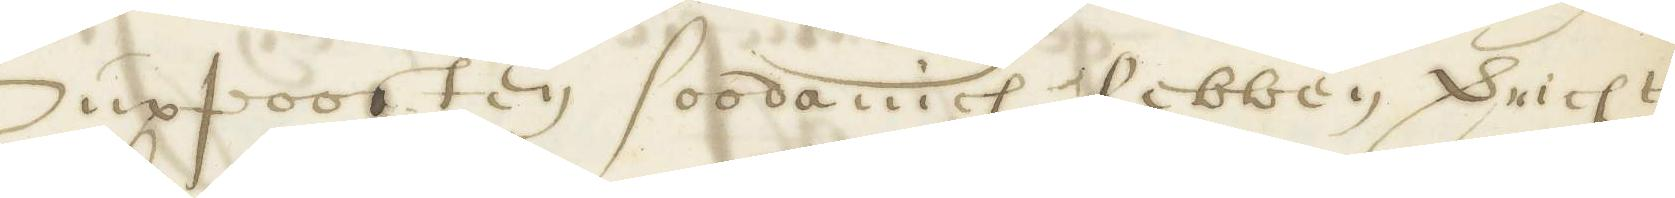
suppoosten soodanich hebben verricht
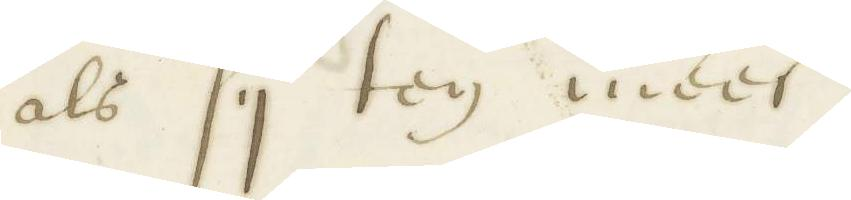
als sij ten meesten diensten
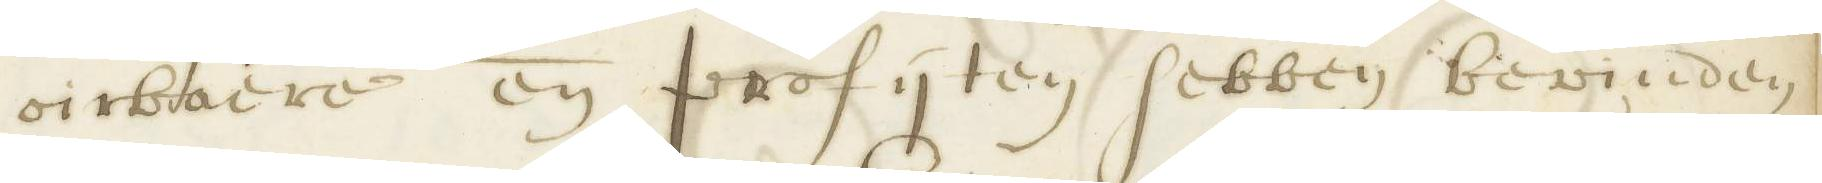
oirbaere en profijten hebben bevinden
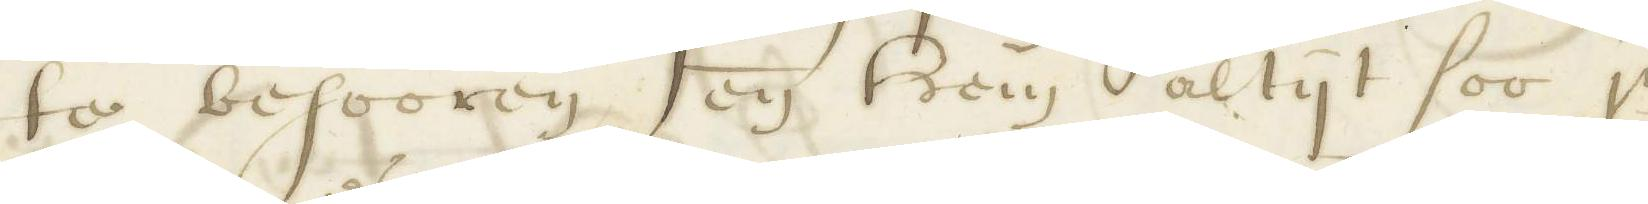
te behooren en hem altijt soo jn
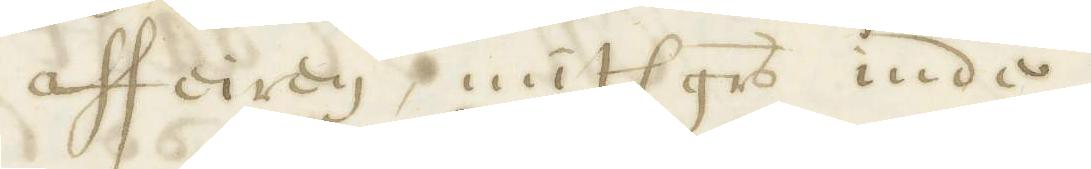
affairen, mitsgrs inde
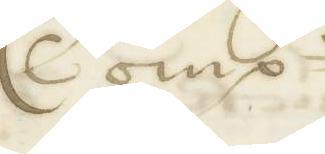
Comp
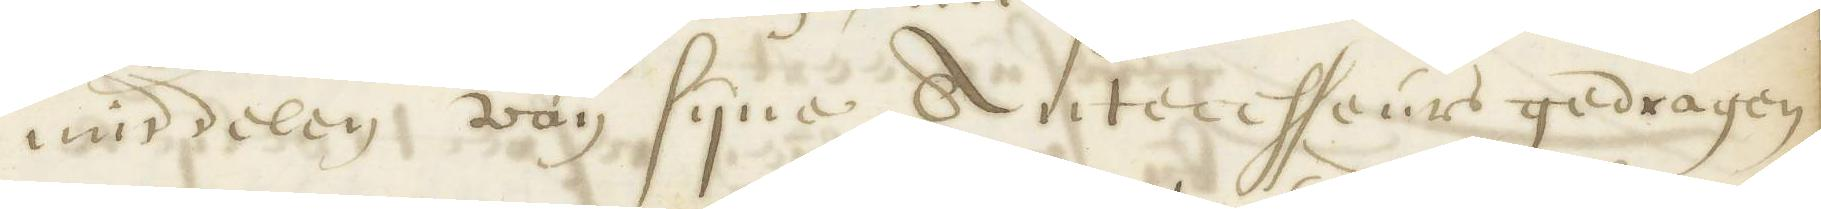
middelen van sijne Antecesseur gedragen
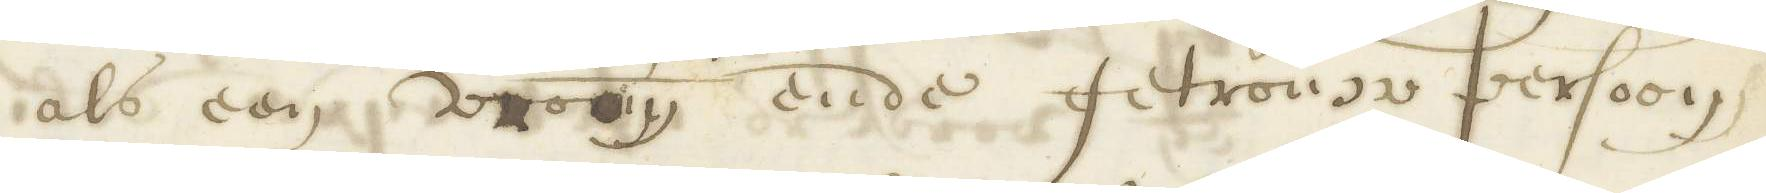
als een vroom ende getrouw persoon
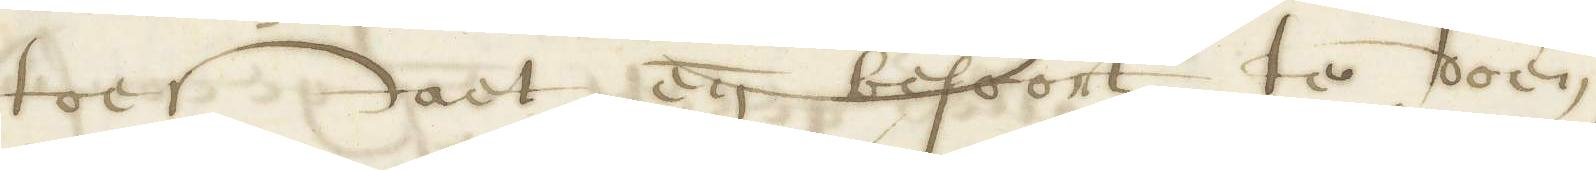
toestaet en behoort te doen
